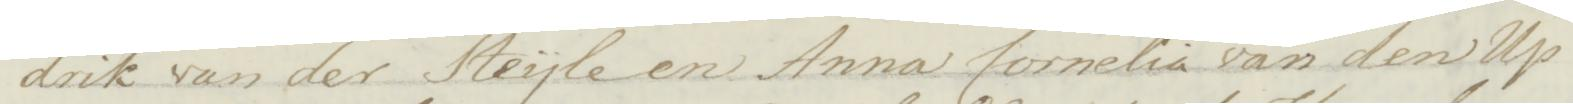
drik van der Heijle en Anna Cornelia van den Up
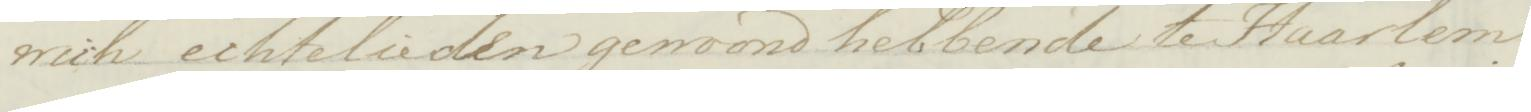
wich echtelieden gewoond hebbende te Haarlem
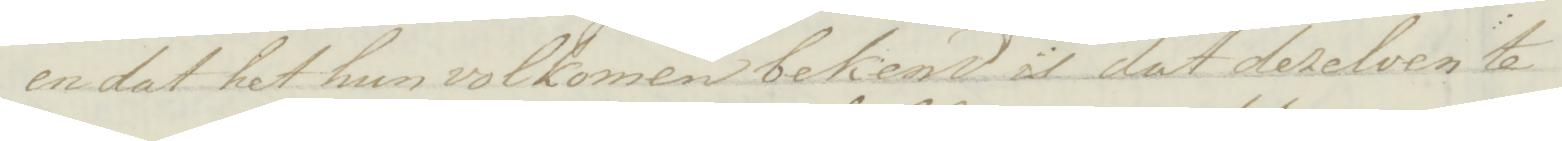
en dat het hun volkomen bekend is dat dezelven te
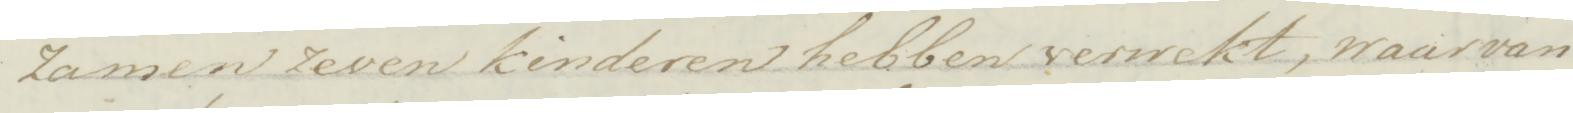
zamen zeven kinderen hebben verwekt, waar van
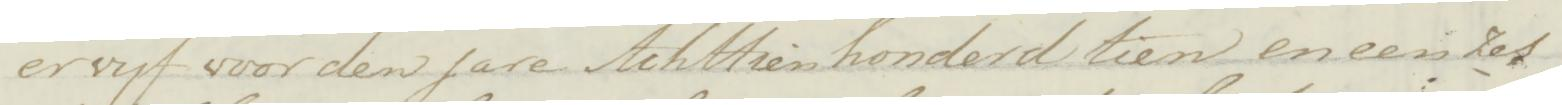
er vyf voor den jare Achttien honderd tien en een zes
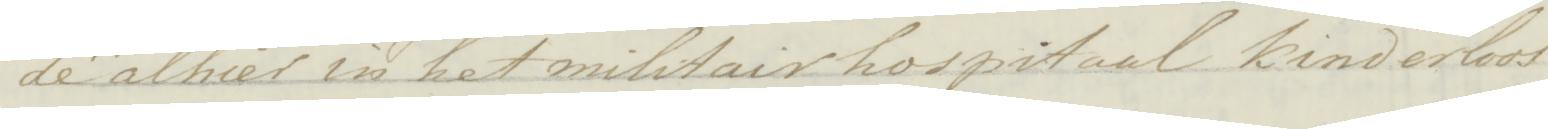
de alhier in het militair hospitaal kinderloos
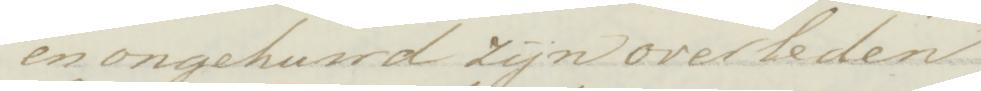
en ongehuwd zijn overleden
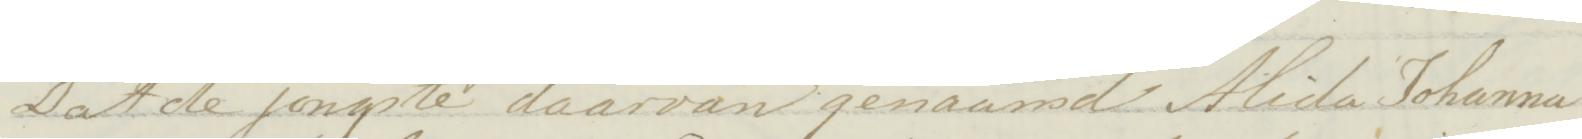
Dat de jongste daarvan genaamd Alida Johanna
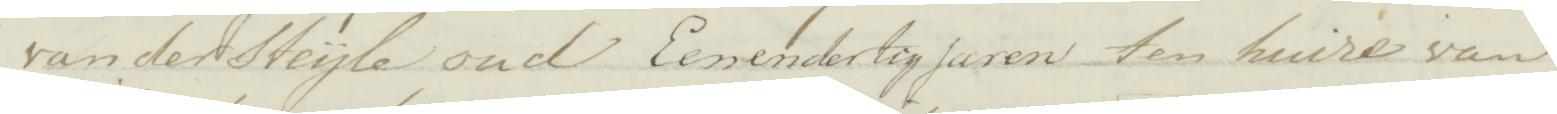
van der Steijle oud Eenendertig jaren ten huize van
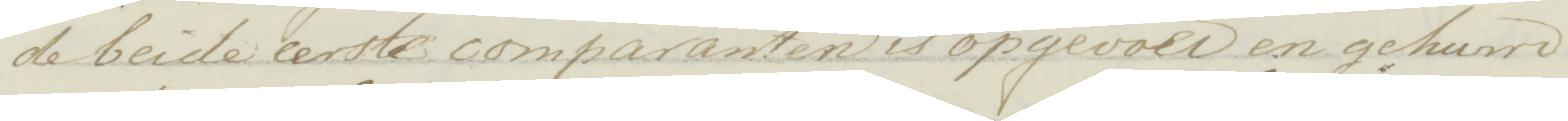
de beide eerste comparanten is opgevoed en gehuwd
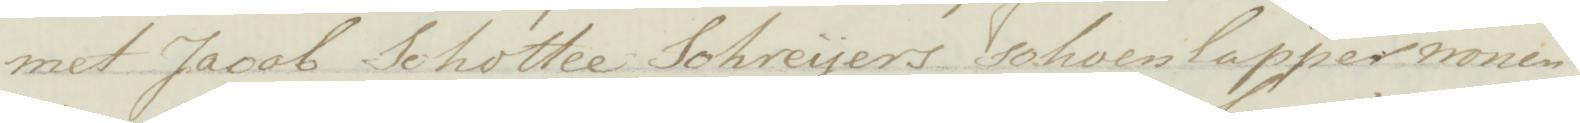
met Jacob Schottee Schreijers schoenlapper wonen
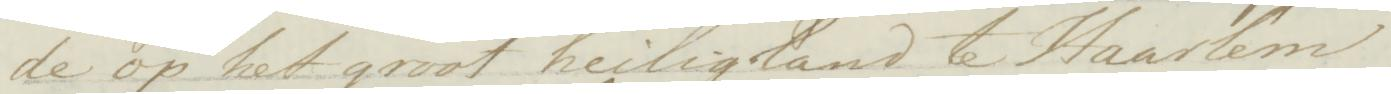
de op het groot heiligland te Haarlem
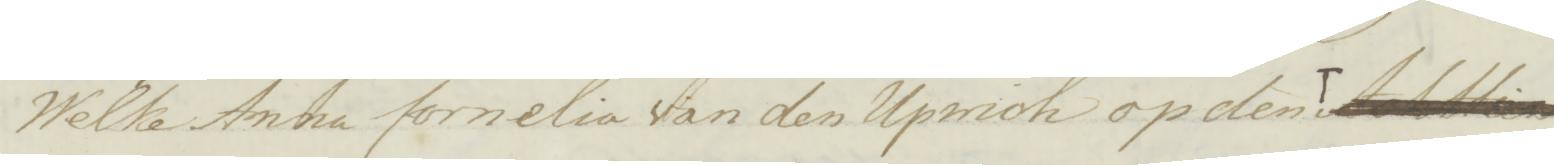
Welke Anna Cornelia van den Upwich op den ¶ Achttien
